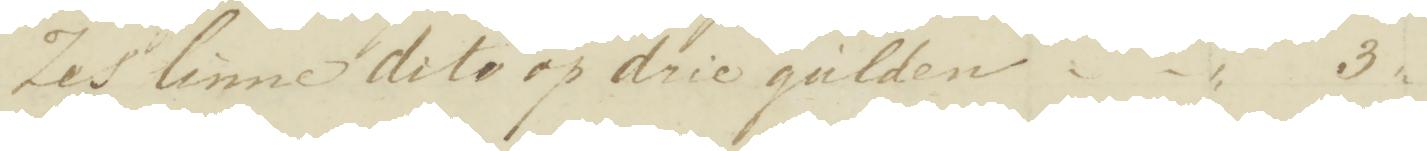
Zes linne dito op drie gulden . . „ 3 „ —
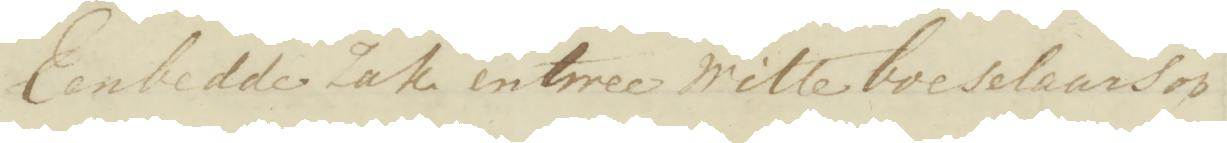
Een bedde zak en twee witte boeselaars op
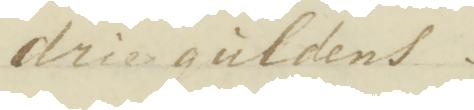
drie guldens . . . . . . . . „ 3 „ —
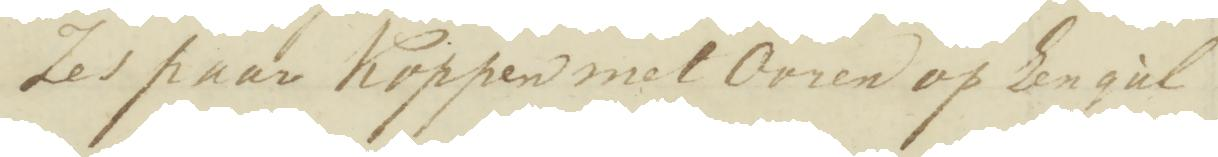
Zes paar Koppen met Ooren op Een gul
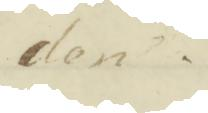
den . . . . . . . . . . . „ 1 „ —
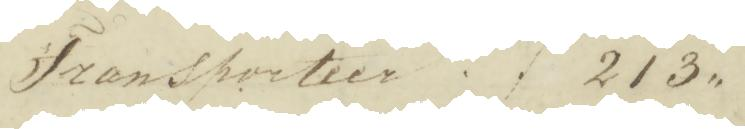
Transporteer . ƒ 213 „ —
